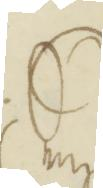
yhvl
